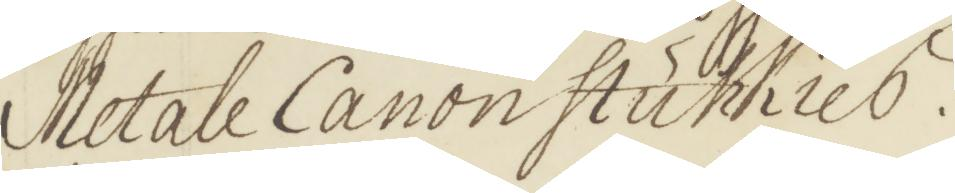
Metale Canon Stukkies.
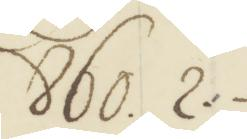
860. 2.
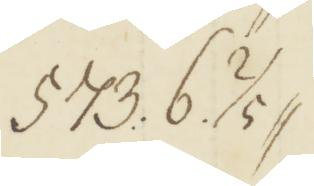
573:6. 2/5 „
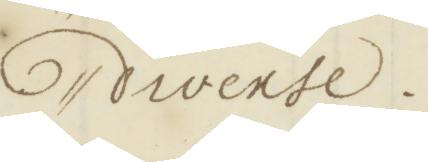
„diverse
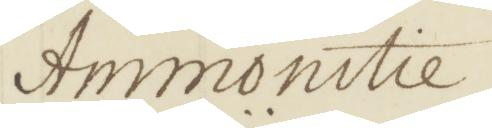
Ammonitie
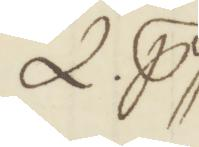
2 p:s
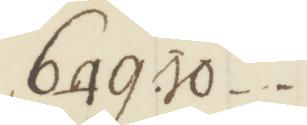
649.10 -.-
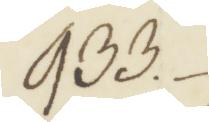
433:—
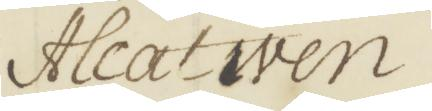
Alcativen
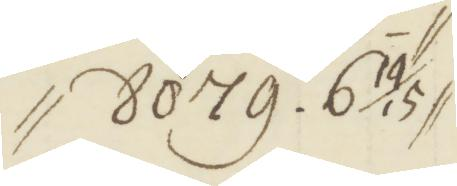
„ 8079.6 14/15 „
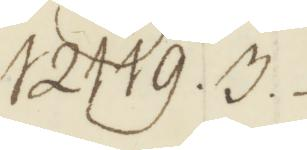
12119.3.
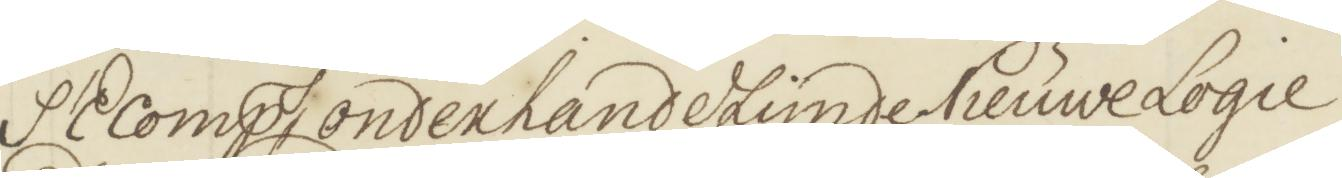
S'Ecomp:s onderhande Zijnde Nieuwe Logie
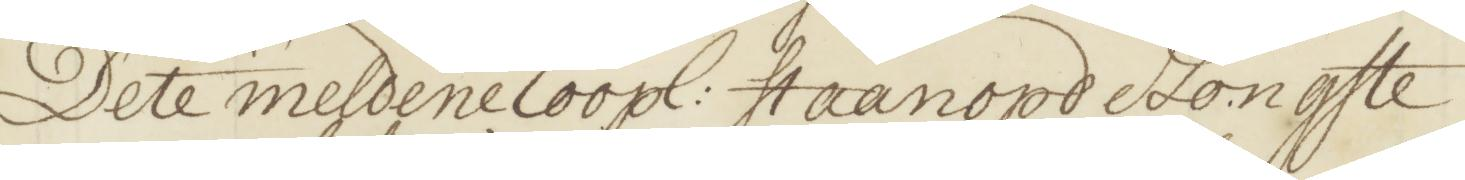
Dete meldene Coopl: staan op de Jongste
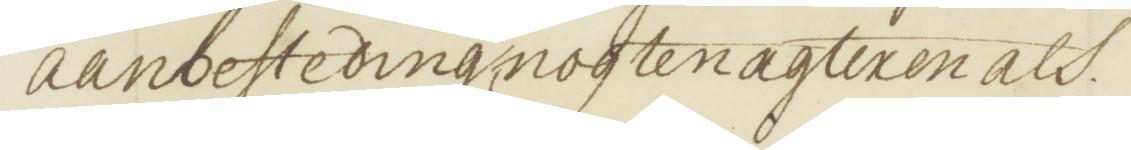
aanbesteding nog ten agteren als.
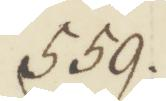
559.
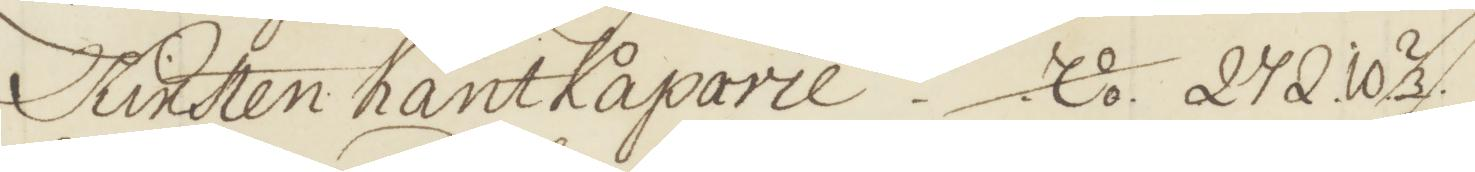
Kirsten Kant Kaparie - r:o/o . 272.10. 2/3:
